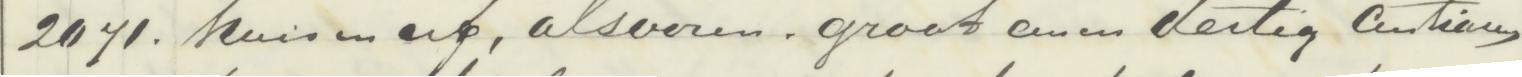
2071. huis en erf, alsvoren, groot een en dertig centiaren
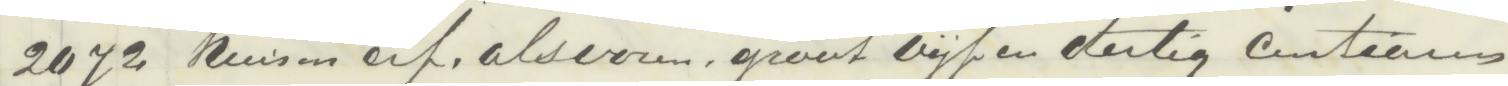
2072 huis en erf, alsvoren, groot vijf en dertig centiaren
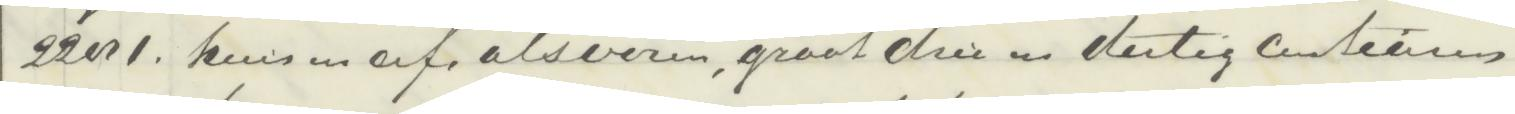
2281. huis en erf, alsvoren, groot drie en dertig centiaren
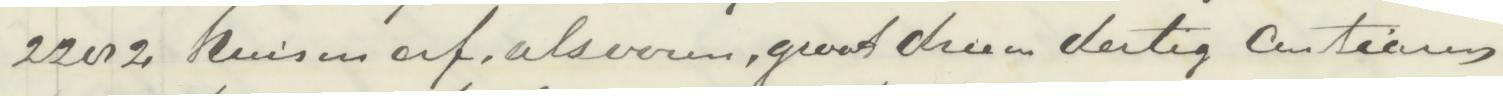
2282 huis en erf, alsvoren, gevos drie en dertig centiaren
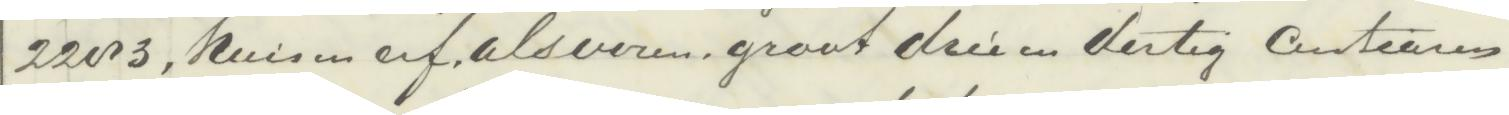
2283, huis en erf, alsvoren, groot drie en dertig centiaren
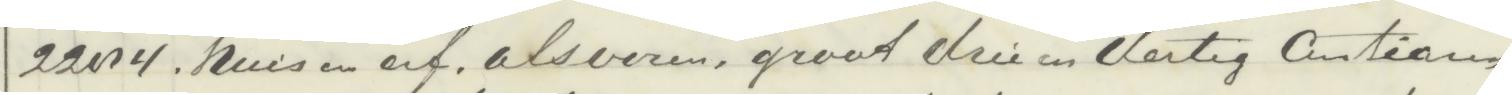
2284. huis en erf, alsvoren, groot drie en dertig centiaren
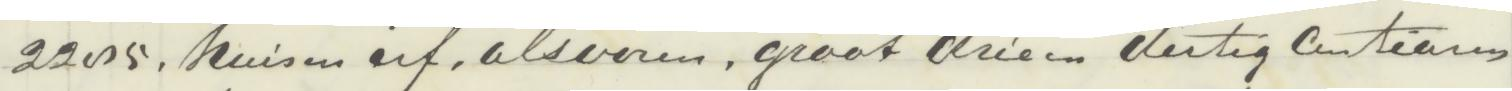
2285, huis en erf, alsvoren, groot drie en dertig centiaren
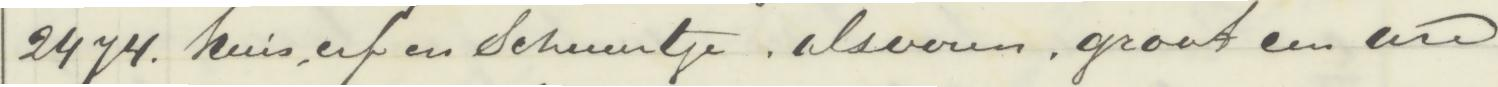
2474. huis, erf en schuurtje, alsvoren, groot een are
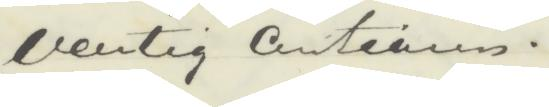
veertig centiaren.
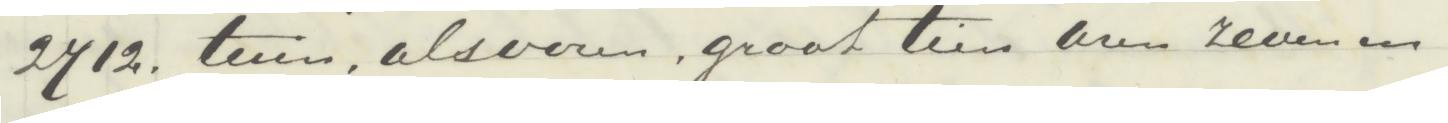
2712. tuin, alsvoren, groot tien aren zeven en
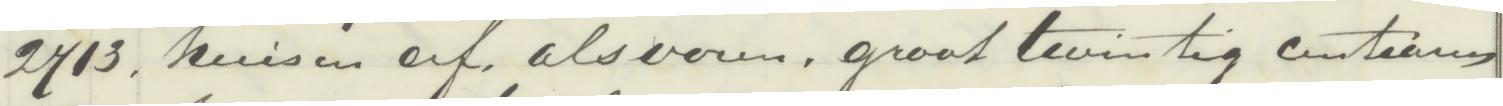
2713, huis en erf, alsvoren, groot twintig centiaren
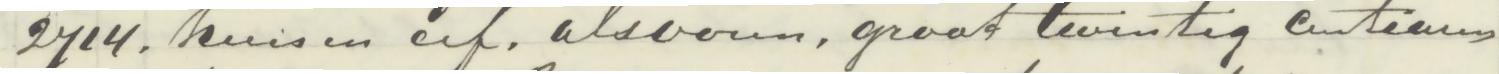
2714, huis en erf, alsvoren, groot twintig centiaren
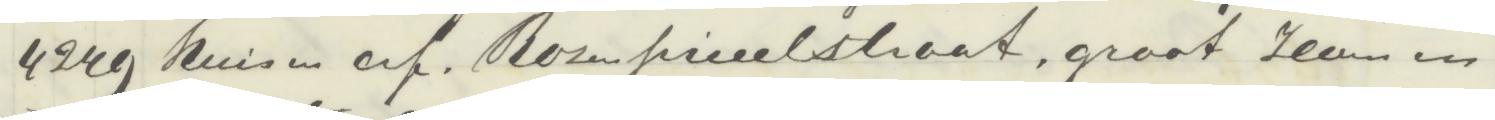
4249 huis en erf, Rozenprieelstraat, groot zeven en
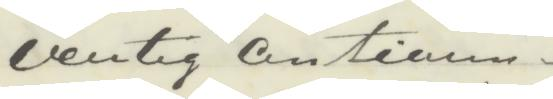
veertig centiaren
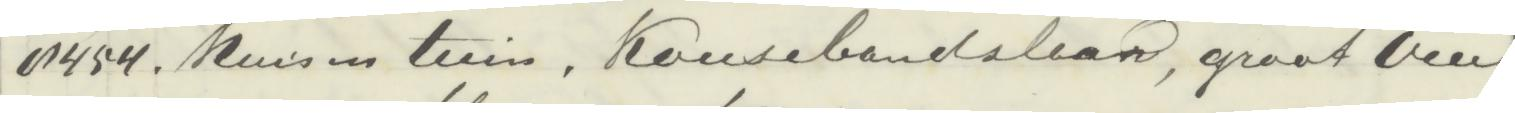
8454. huis en tuin, Kousebandslaan, groot vier
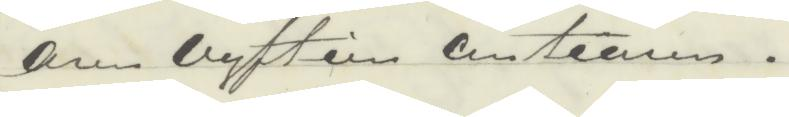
aren vyftien centiaren.
